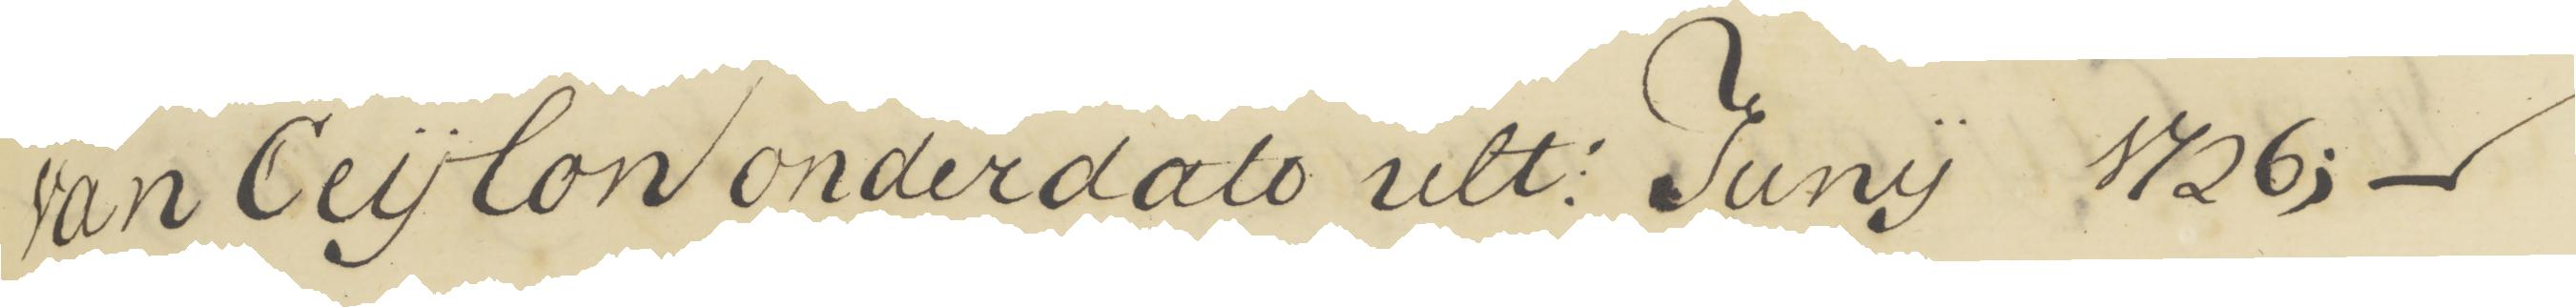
van Ceijlon onder dato ult: Iunij 1726; —
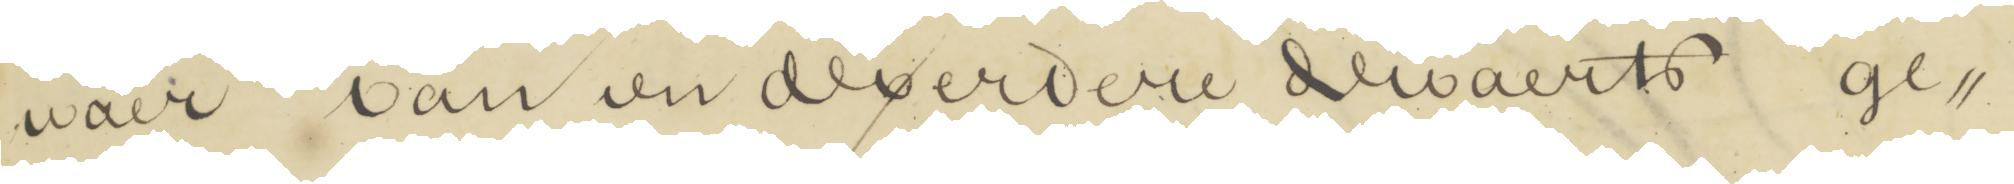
waer van en de verdere dewaerts ge„
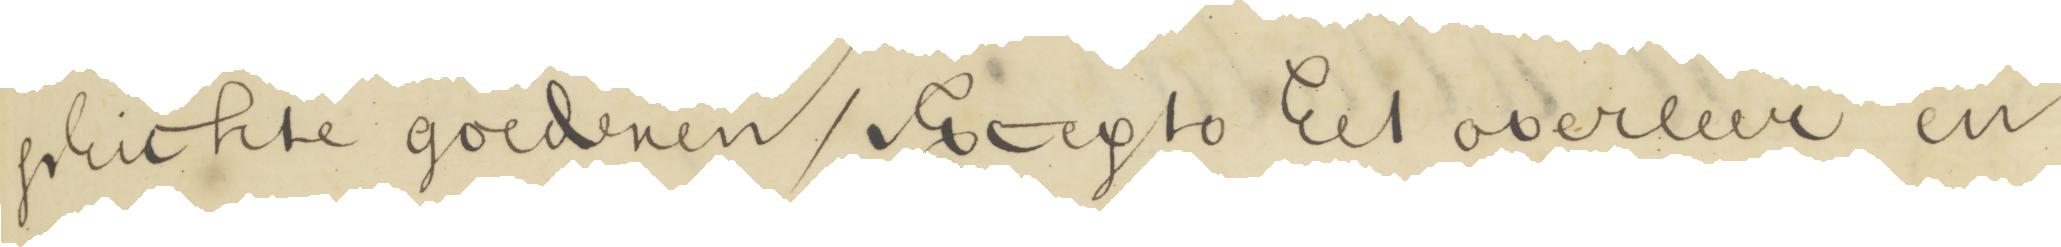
schickte goederen / Excepto het overleer en
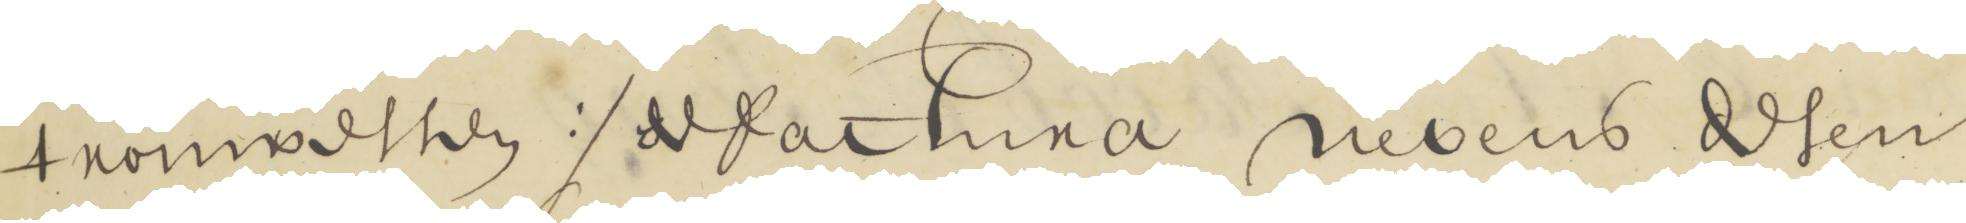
tromvellen :/ defactura nevens desen
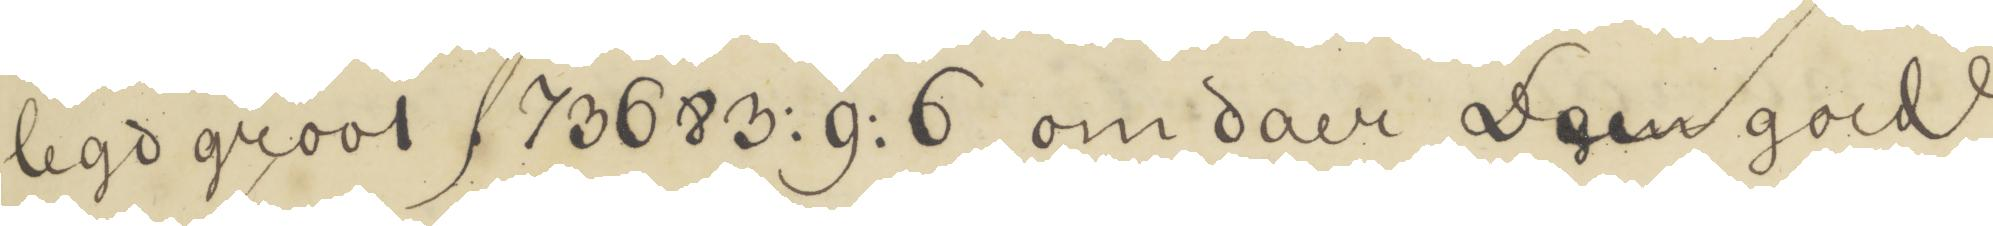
legd groot ƒ73683:9:6 om daer tegen goede
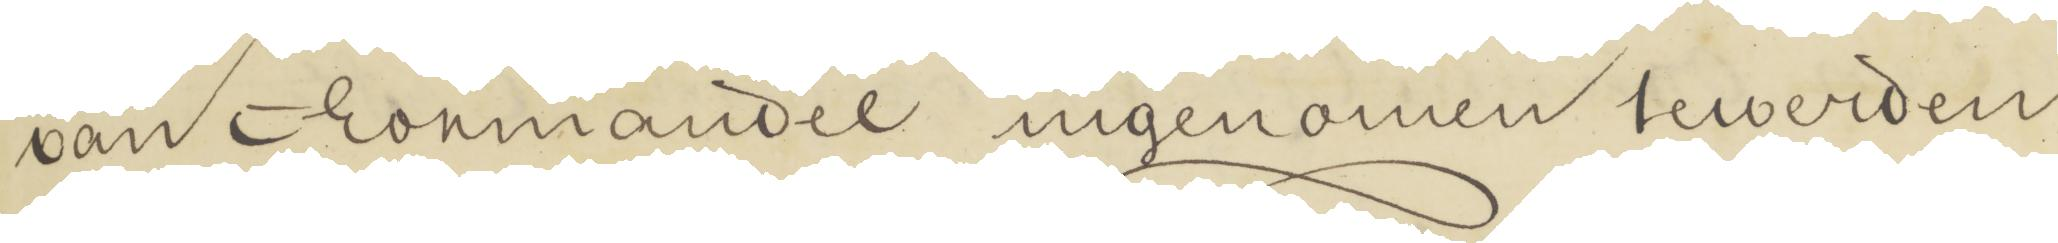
van Chormandel ingenomen tewerden
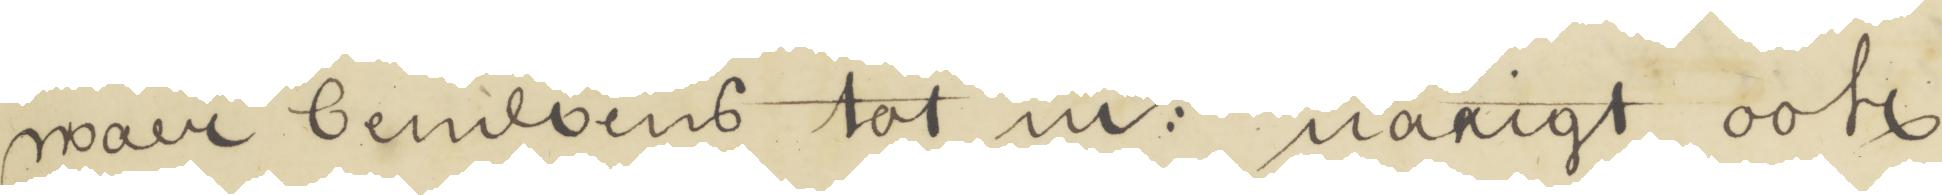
waer benevens tot uE: narigt ook
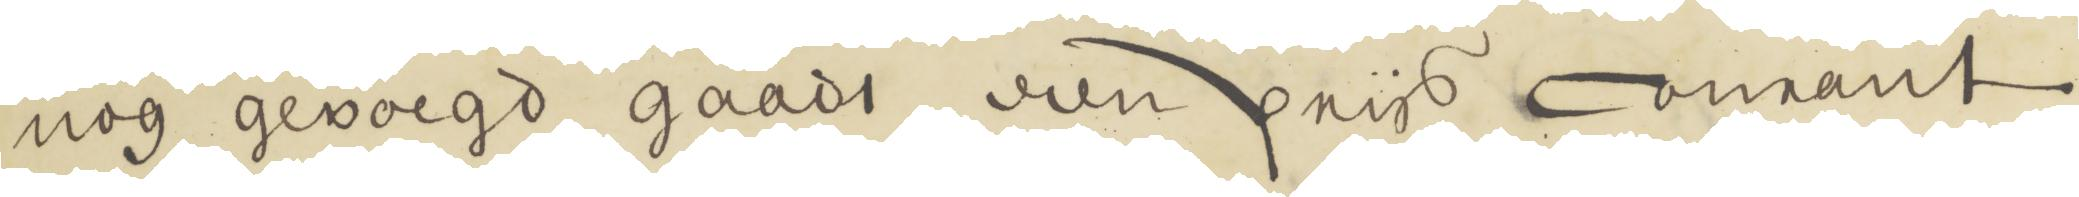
nog gevoegd gaadt een prijs Courant
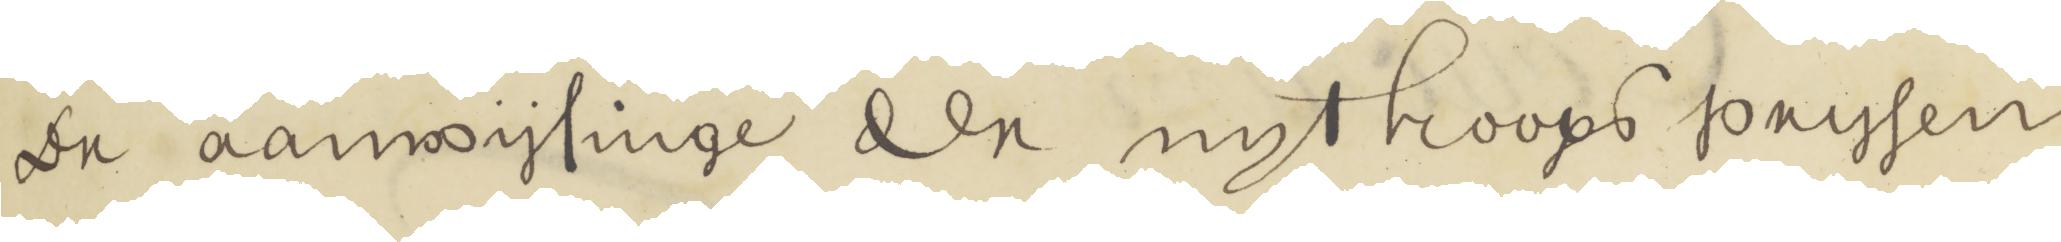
ter aanwijsinge der uyt koops prysen
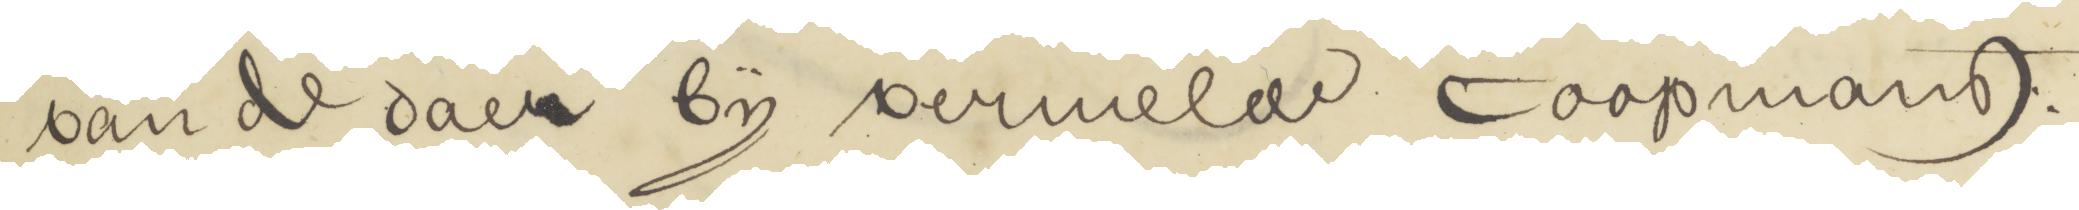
van de daer bij vermelde Coopmans:
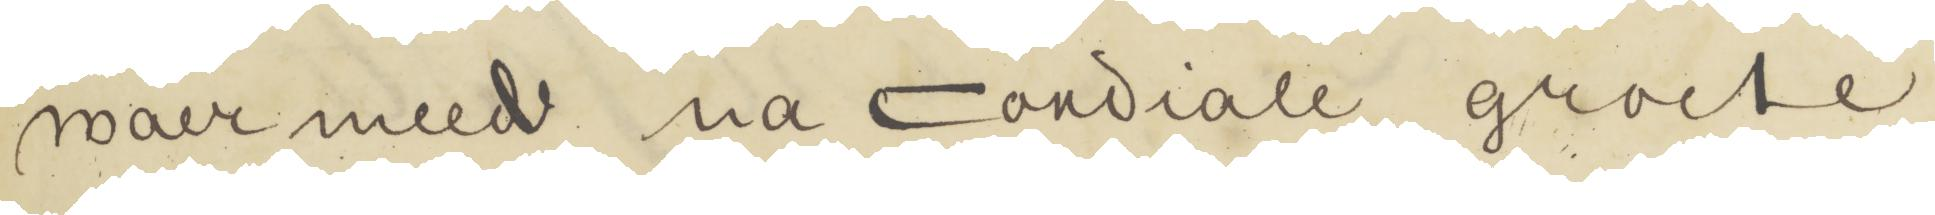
waer meede na Cordiale groete
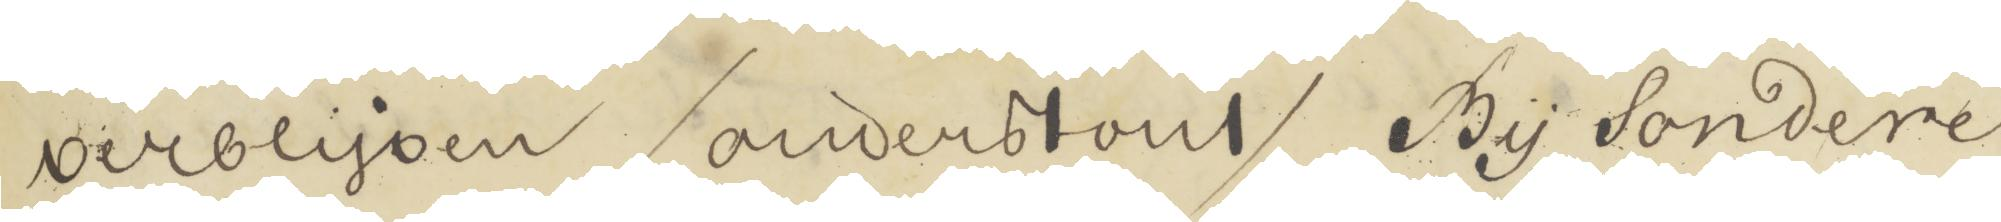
verblijven /onderstont/ Bij sondere
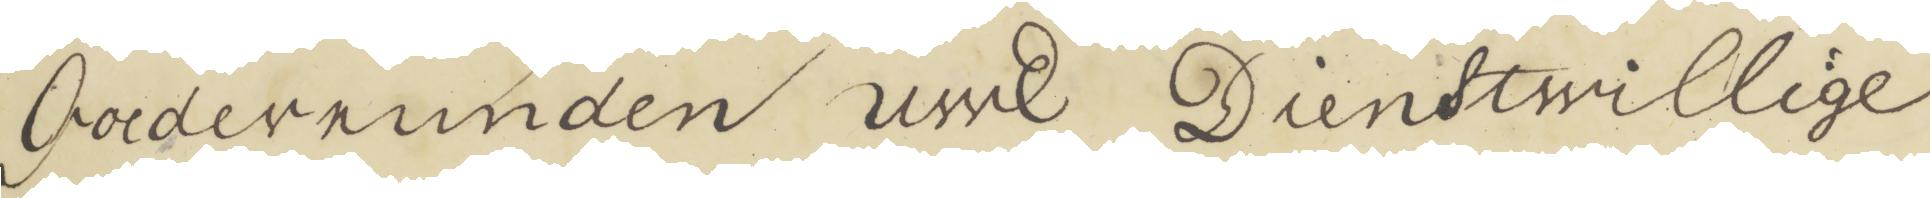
Goedevrunden uwE Dienstwillige
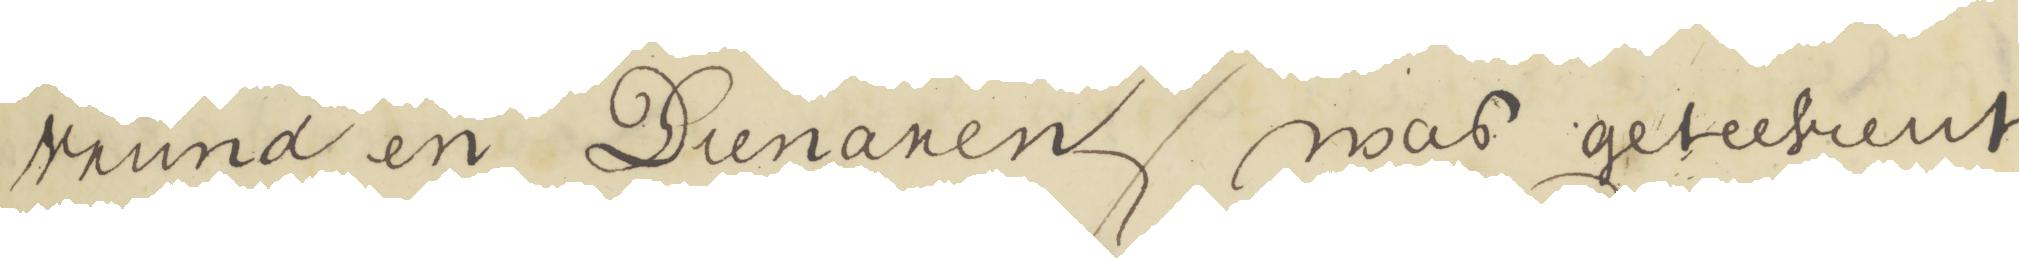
vrund en Dienaren / was geteekent
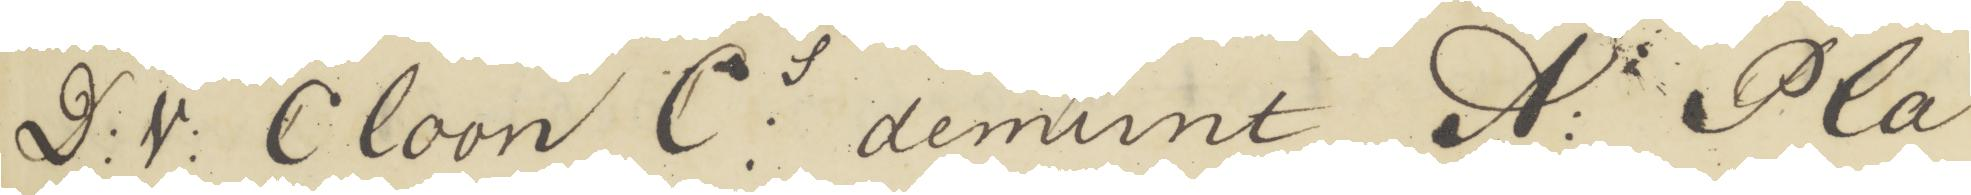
D: V: Cloon C:s demunt A:o Pla
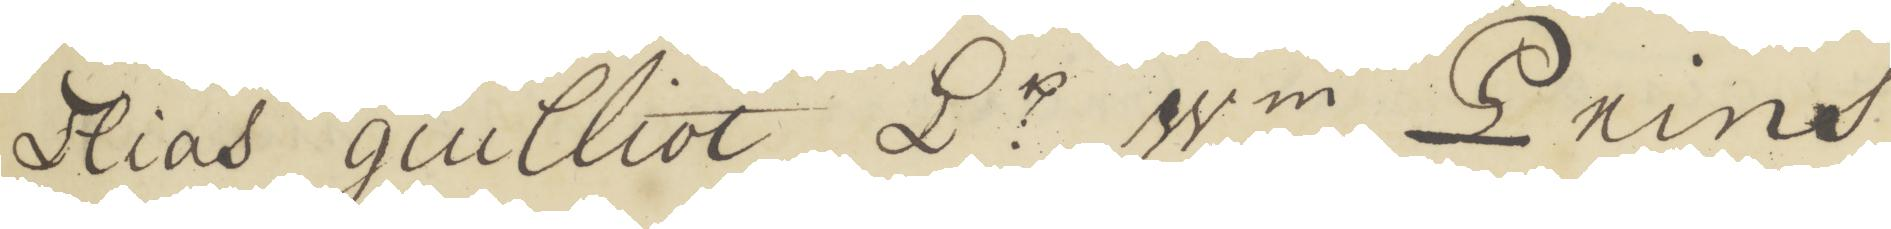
Elias guilliot L:k w:m Prins
